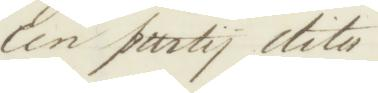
Een partij dito
